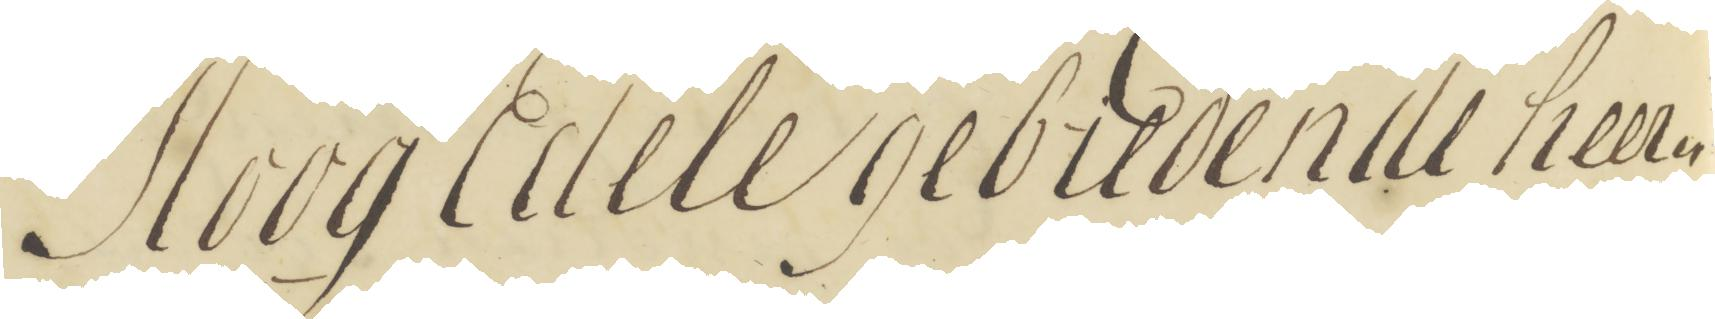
Hoog Edele gebiedende heer
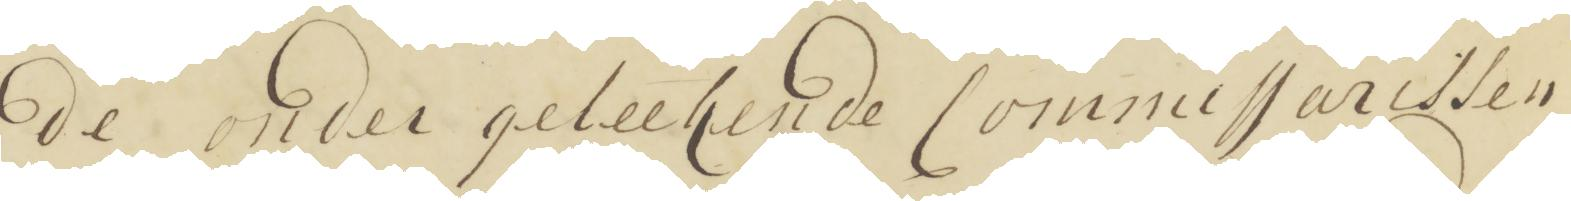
de onder geteekende commissarissen
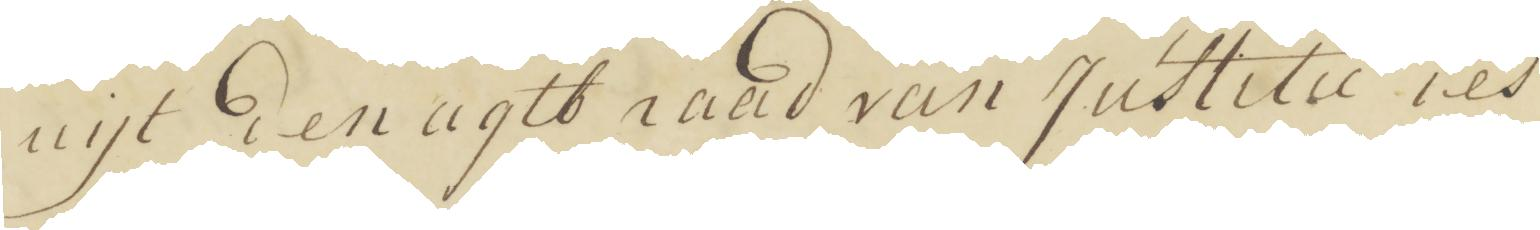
uijt den agtb raad van Justitie des
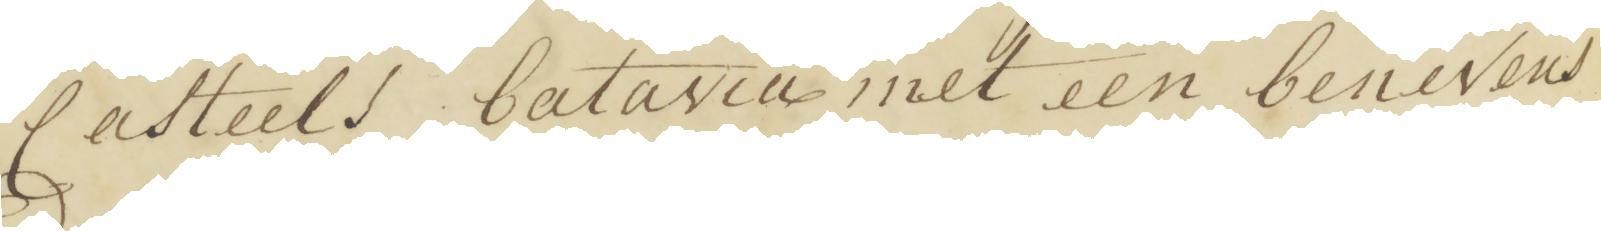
Casteels batavia met een benevens
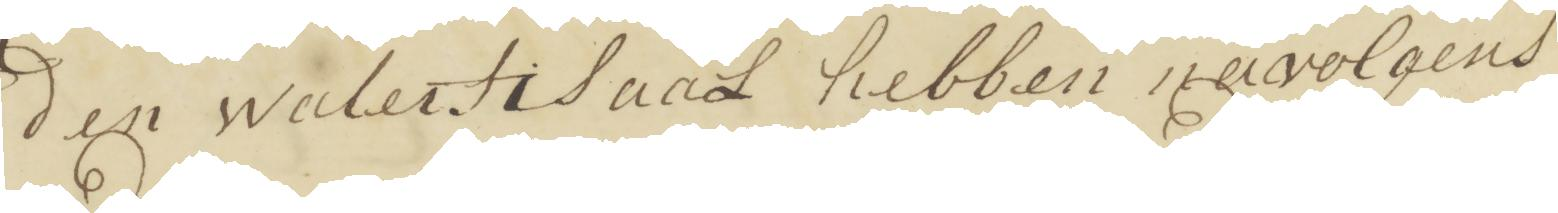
den waterfisaal hebben navolgens
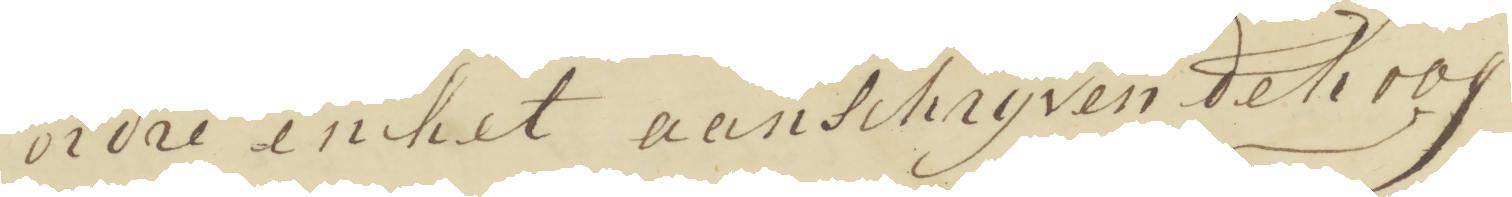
ordre en het aanschrijven de hoog
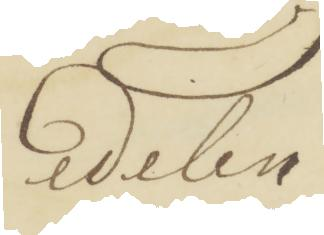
edelen
